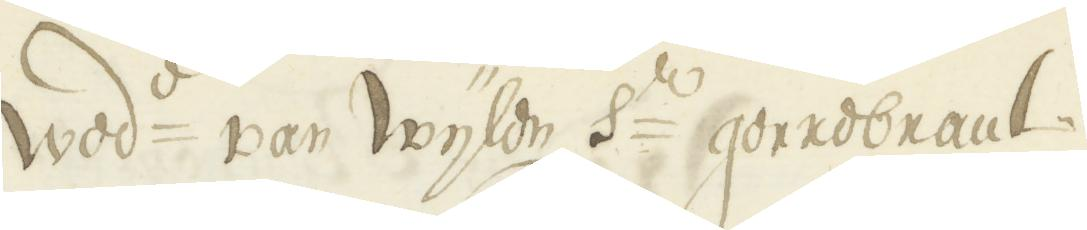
wed=e van Wijlen h=r gerrebrant
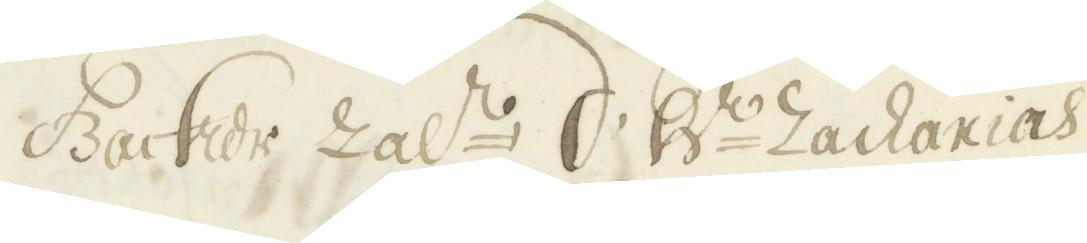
Backer zal=r D H=r Zacharias
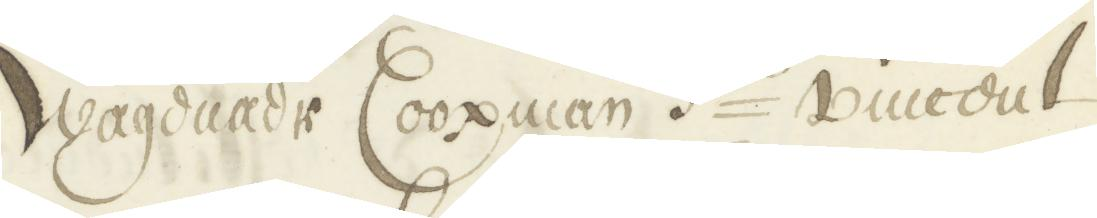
Wagenaer Coopman s=r vincent
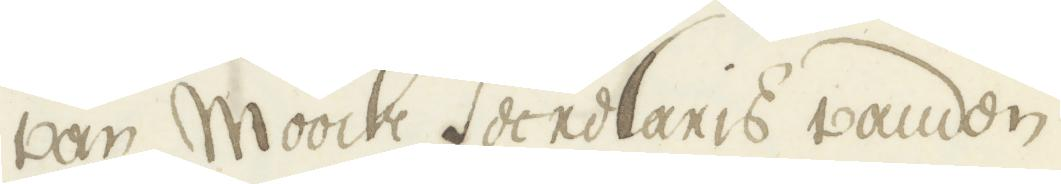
van Moock secretaris vanden
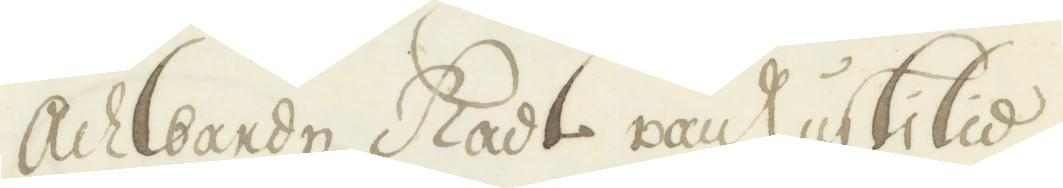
Achtbaren Raet van Justitie,
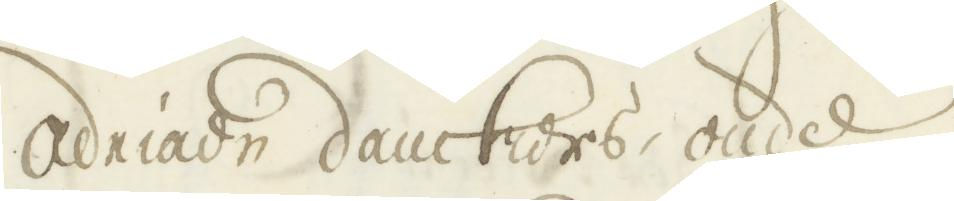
Adriaen danckers, ende
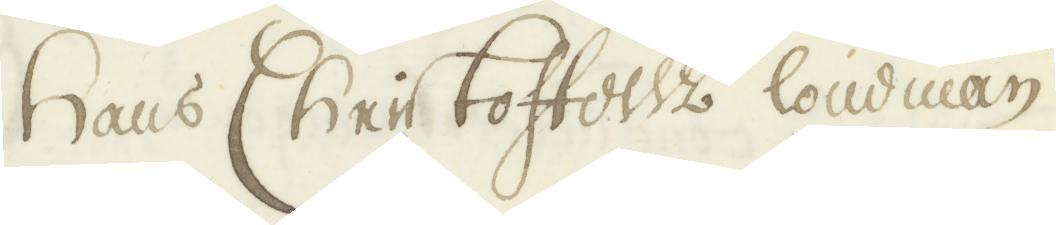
Hans Christoffelszne loueman
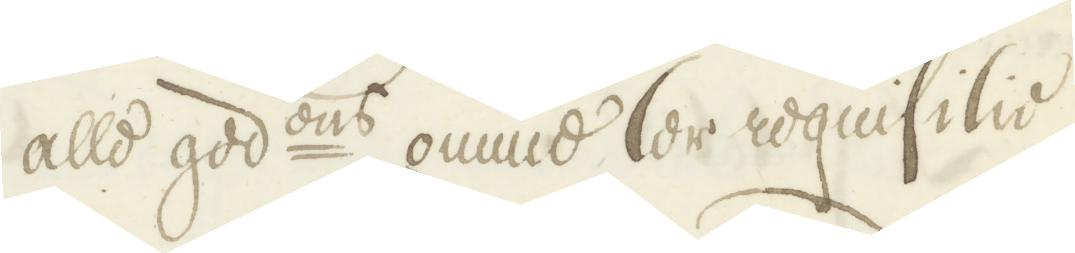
alle ged=ens omme ter requisitie
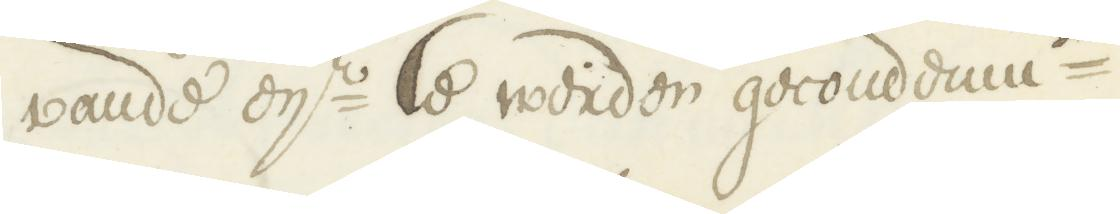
vande eij=r te werden gecondemn=t
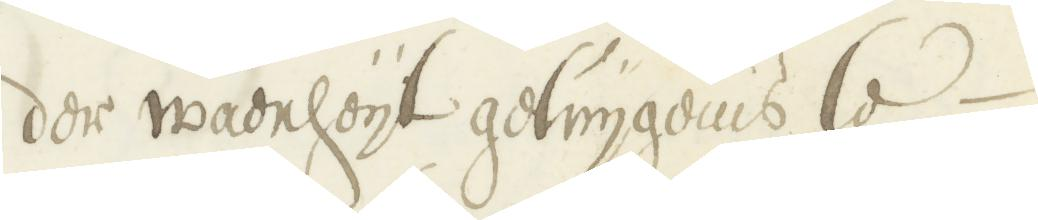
der waerheijt getuijgenis te —
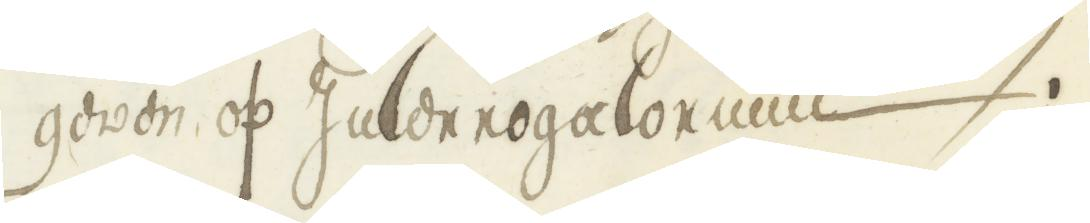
geven op Jnterrogatorium /.
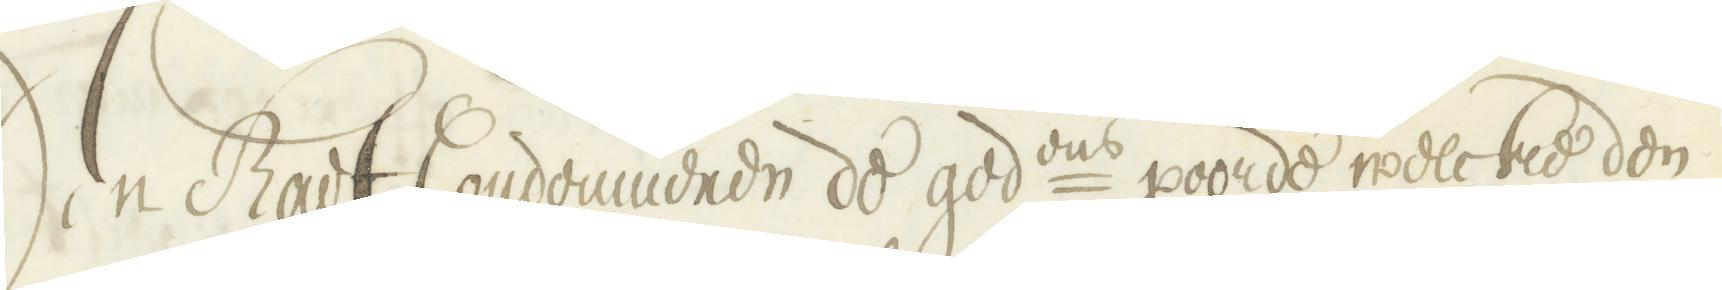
Den Raet Condemneren de ged=ens voorde welcke den
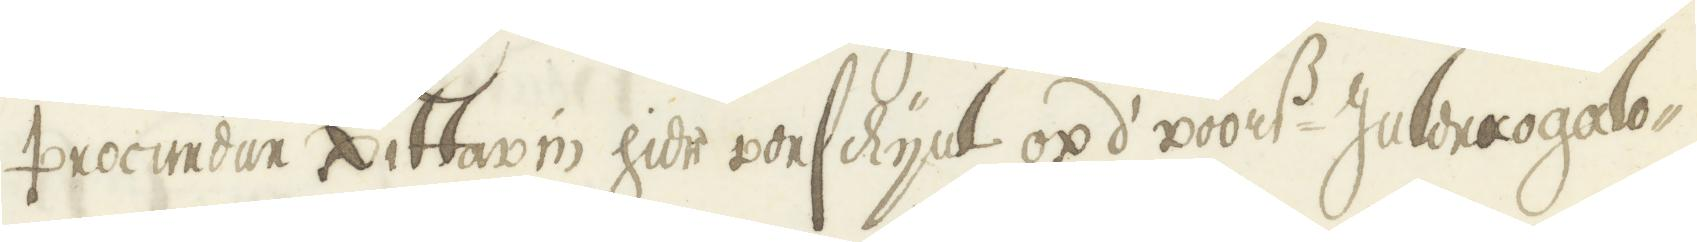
procureur pittavin hier verschijnt op d’ voors= Jnterrogato„
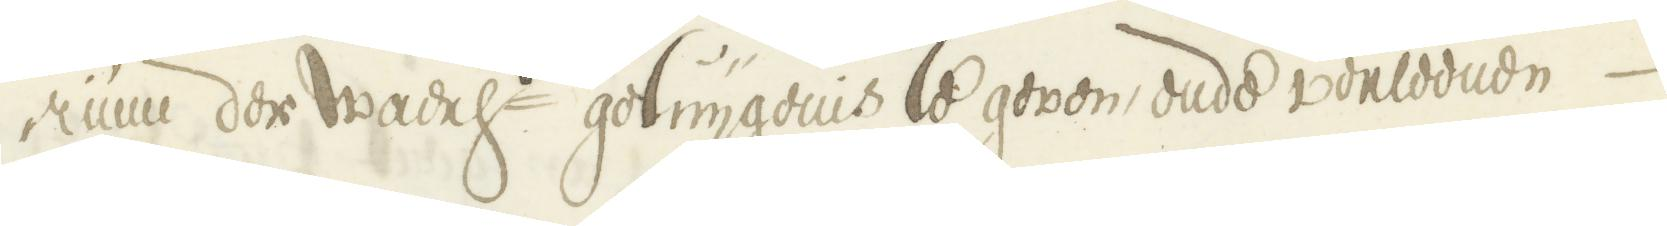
rium der waerh=t getuijgenis te geven, ende verleenen —
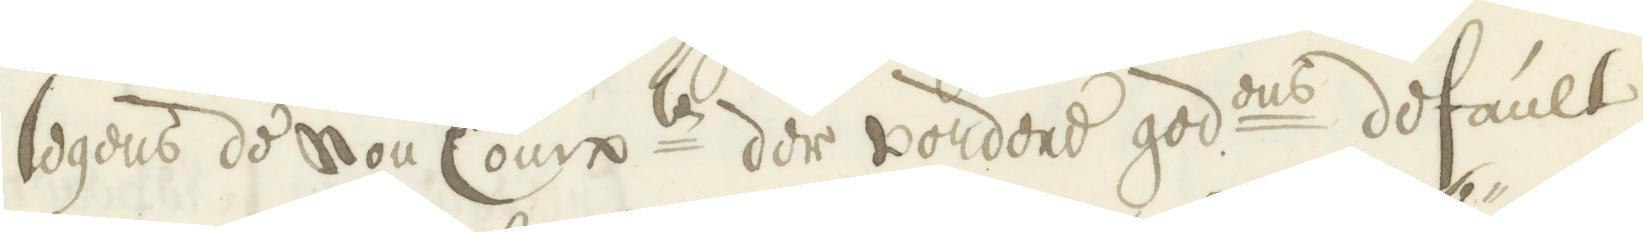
tegens de von Comp=ten der verdere ged=ens default
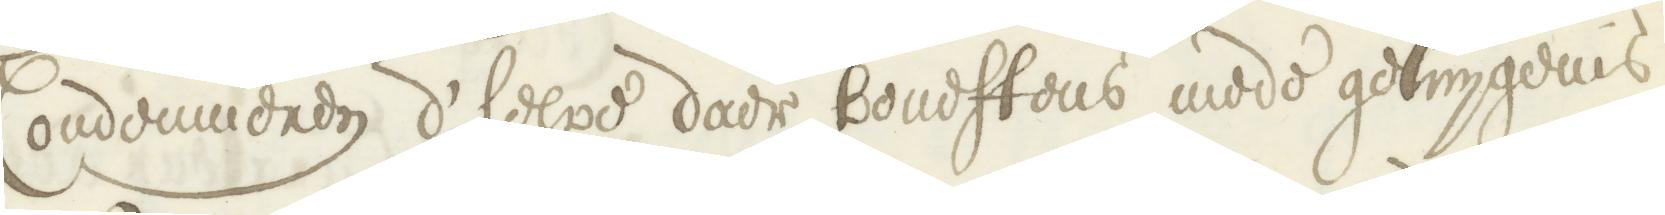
Condemneren d’ selve daer beneffens mede getuijgenis
